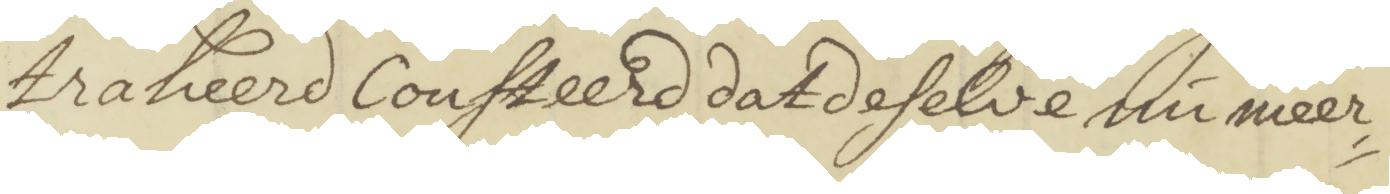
traheerd consteerd dat deselve nu meer„
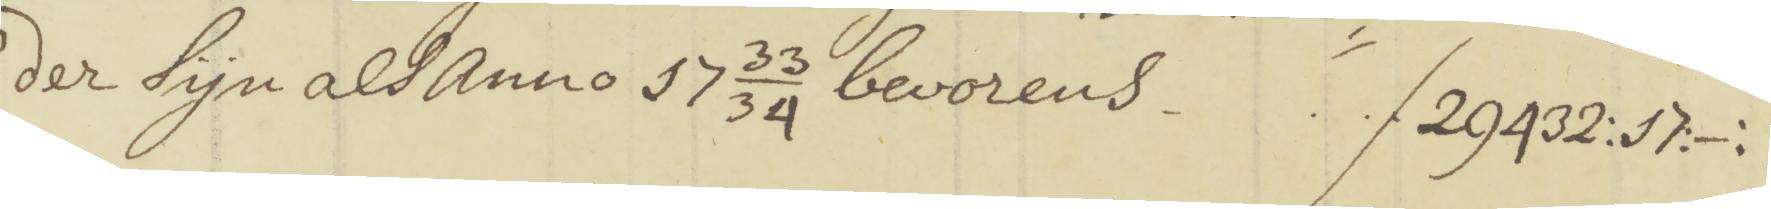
der sijn als Anno 17 33/34 bevorens . . ƒ29432:17:—:
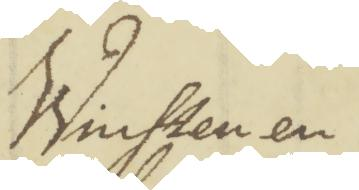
Winsten en
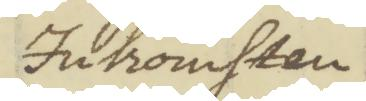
Inkomsten
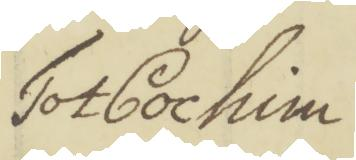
Tot Cochim
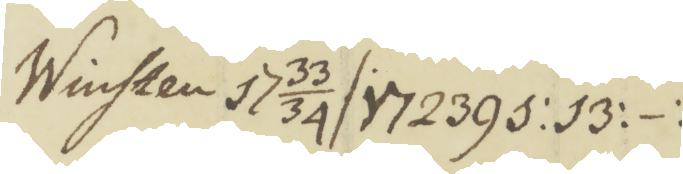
Winsten 17 33/34 /172391:13:—
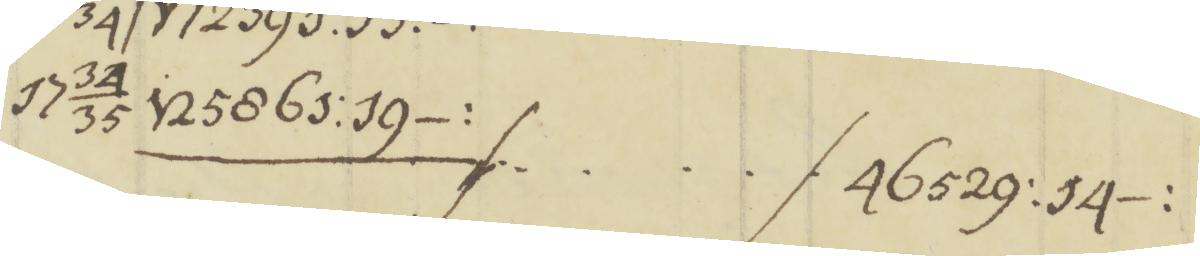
17 34/35 125861:19—: ƒ. - . . . ƒ46529:14—:
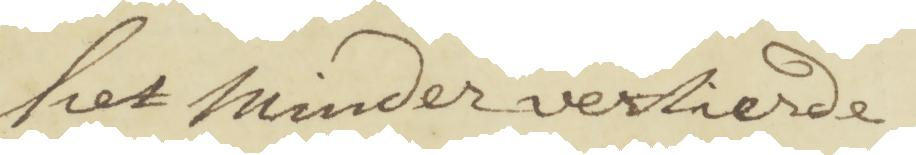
het minder vertierde
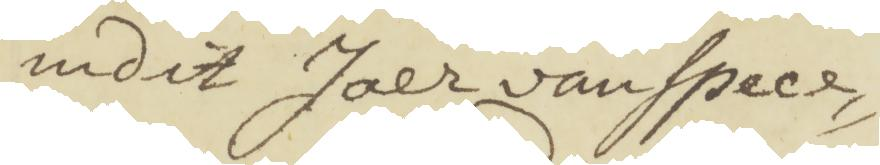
in dit Jaer van spece„
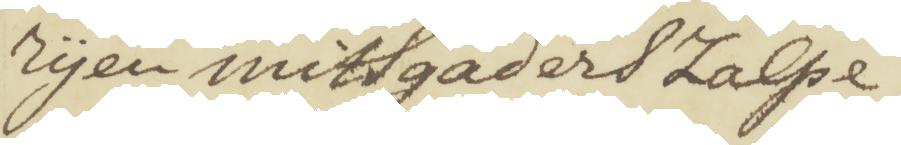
rijen mitsgaders zalpe
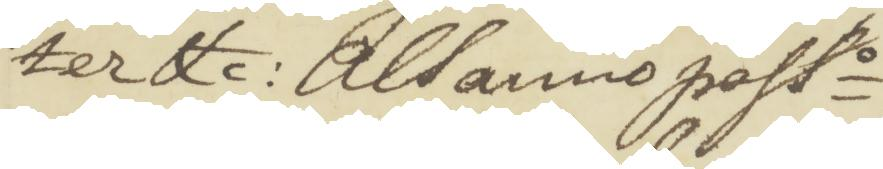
ter &c: Als anno pass=o
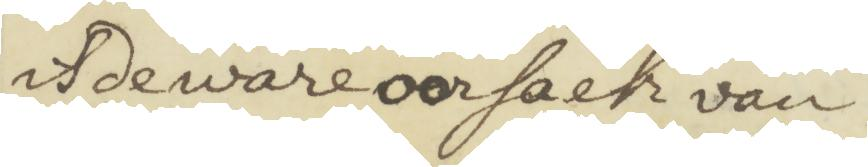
is de ware oorsaek van
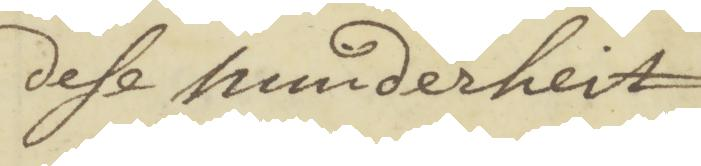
dese minderheit
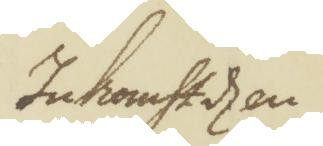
Inkomsten en
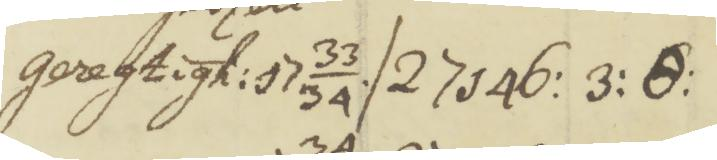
geregtigh: 17 33/34.ƒ27146: 3: 8:
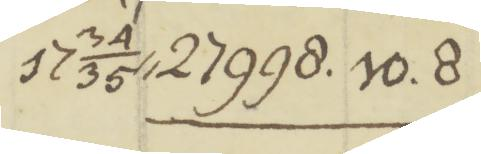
17 34/35 „ 27998.10.8
